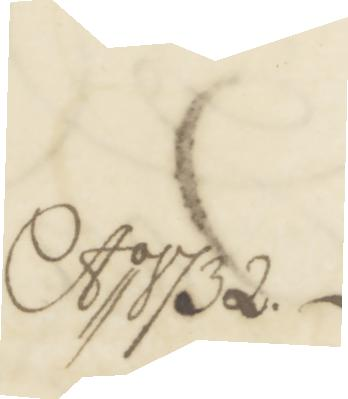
A„o 1732
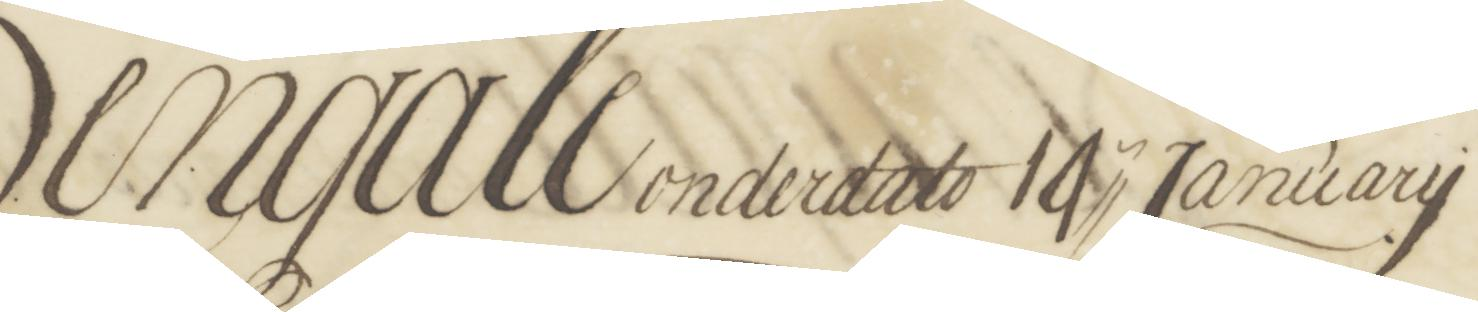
Van Bengale onderdato 14„e Januarij
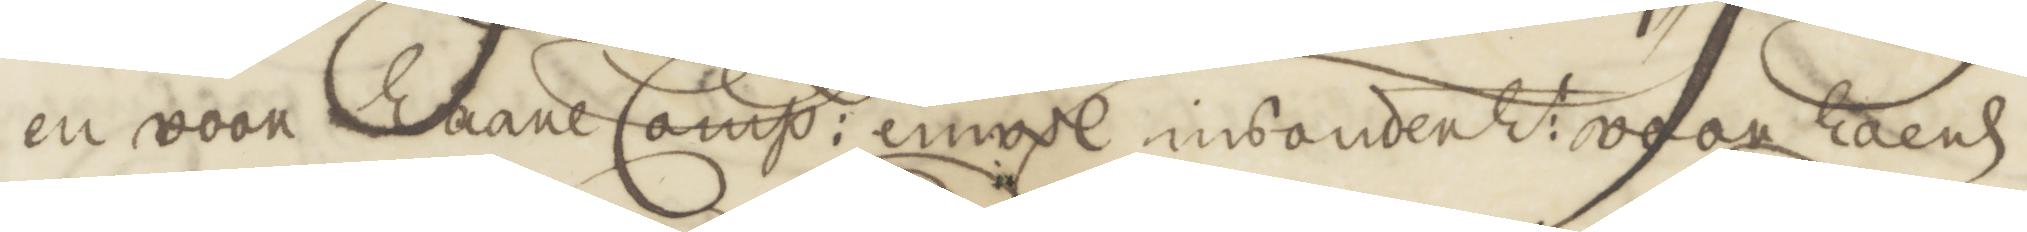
en voor haare Comp:s en wel insonderh:t voor haeren
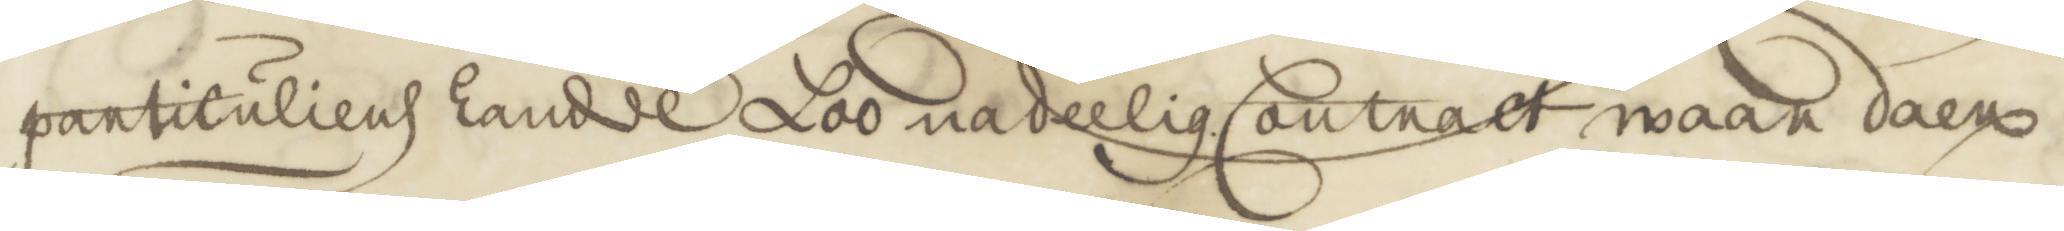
particulieren handel Zoo nadeelig Contract waar daer
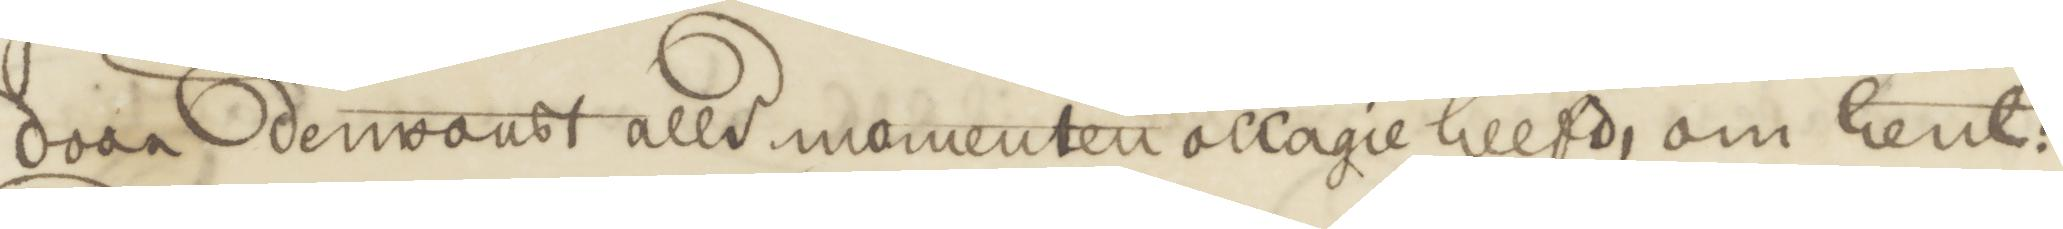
door den vorst alle momenten occagie heefd, om henl:
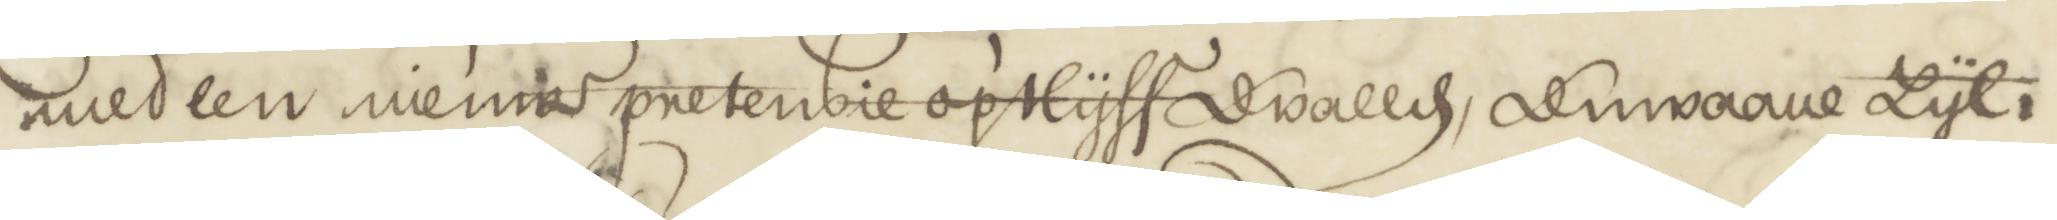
med een nieuwe pretensie op 'tlijff te vallen, tenwaare Zijl:
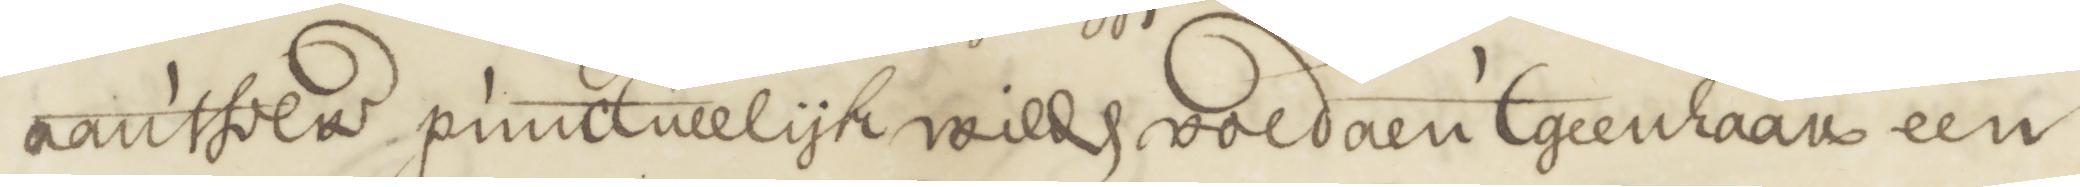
aan 'tselve punctueelijk wilden voldaen ’t geen haar een
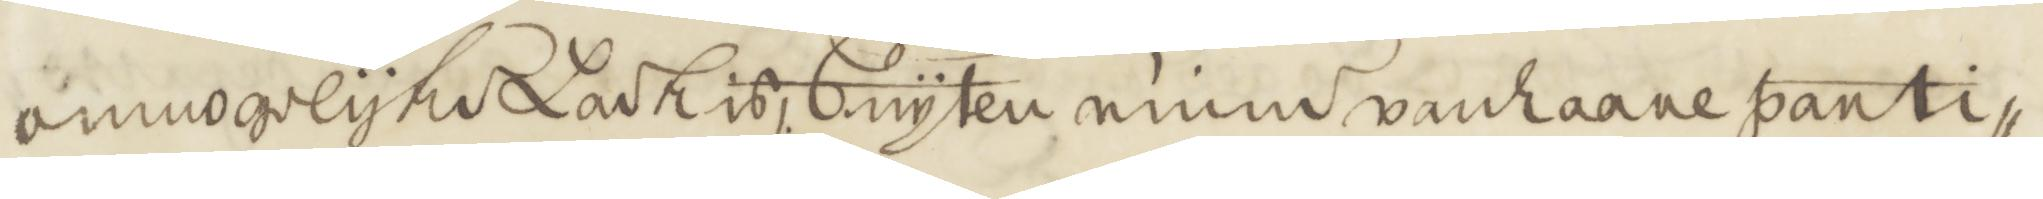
onmogelijke Zaek is, buijten zinne van haare parti„
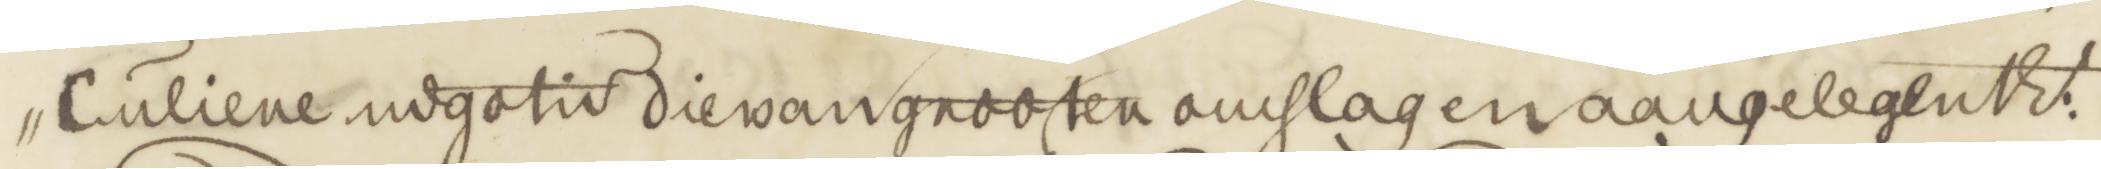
„culiere negotie die van grooter omslag en aangelegenth:t
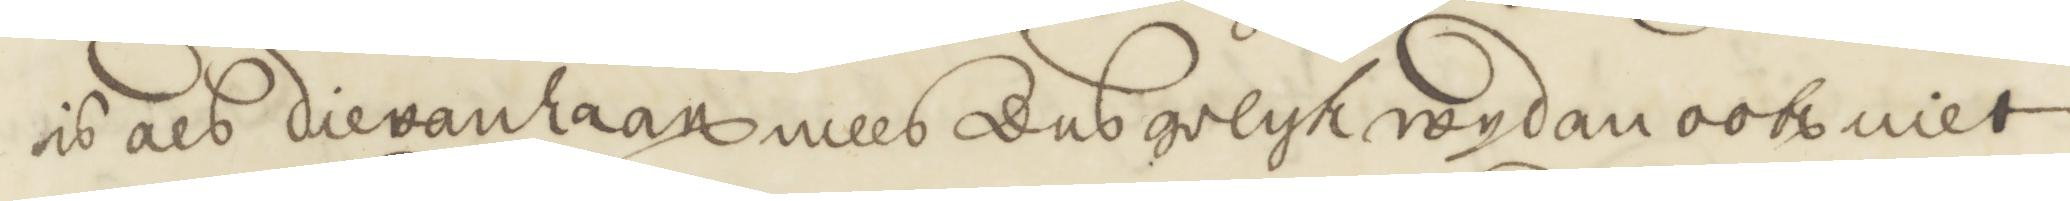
is als die van haar meesters gelyk wij dan ook niet
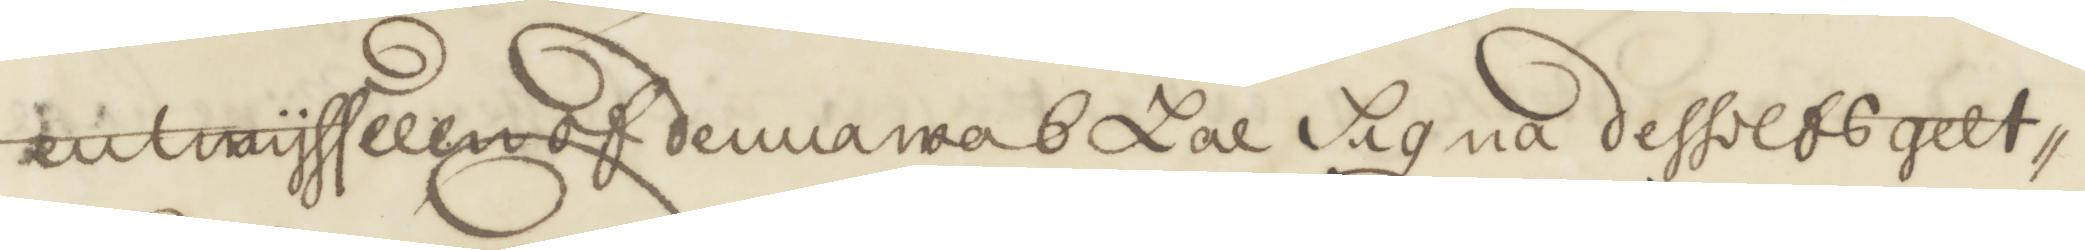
en twijffelen of den nawab Zal Sig na desselfs gelt„
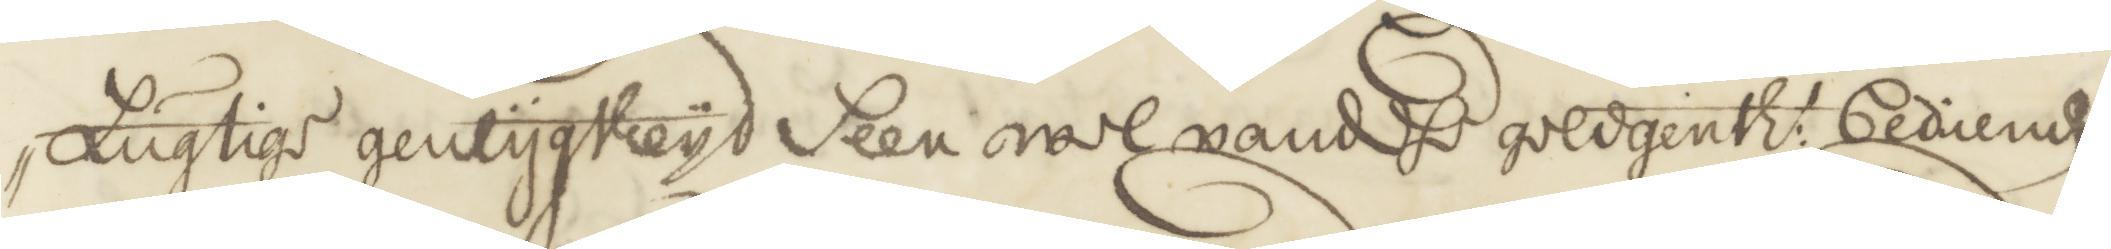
„Zugtige genlijgtheijd Seer wel van dese gelegenth:t bedienen
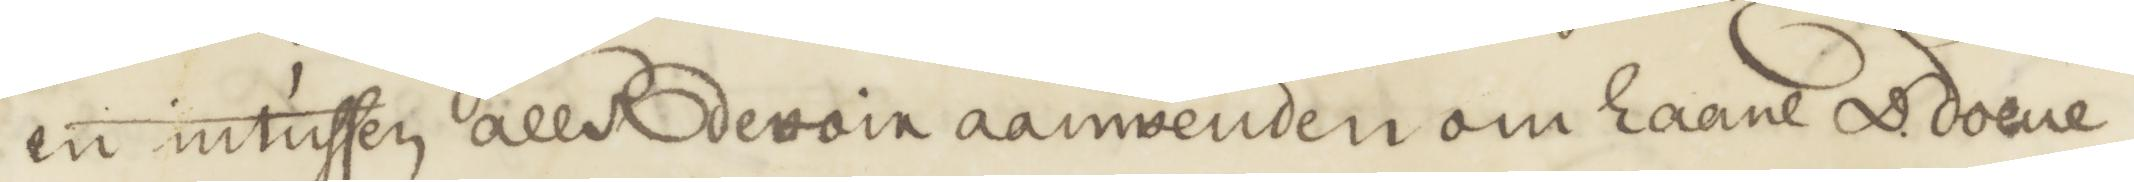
en intussen alle devoir aanwenden om haare te doene
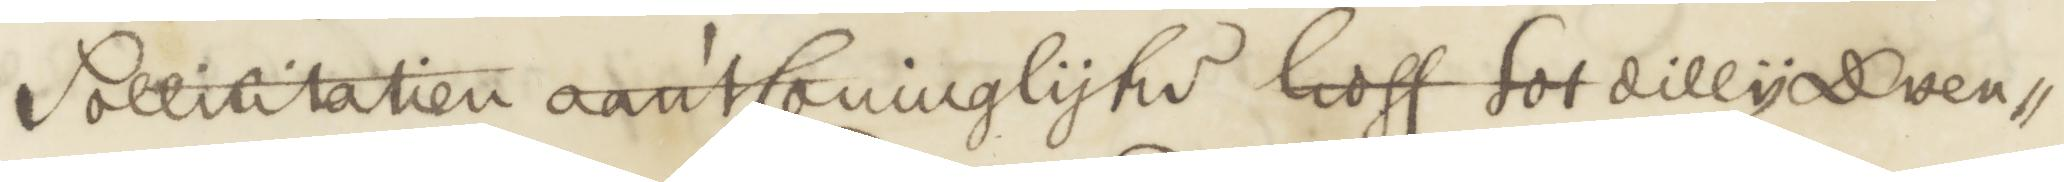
Sollicitatien aan ’t Coninglijke hoff tot dillij tever„
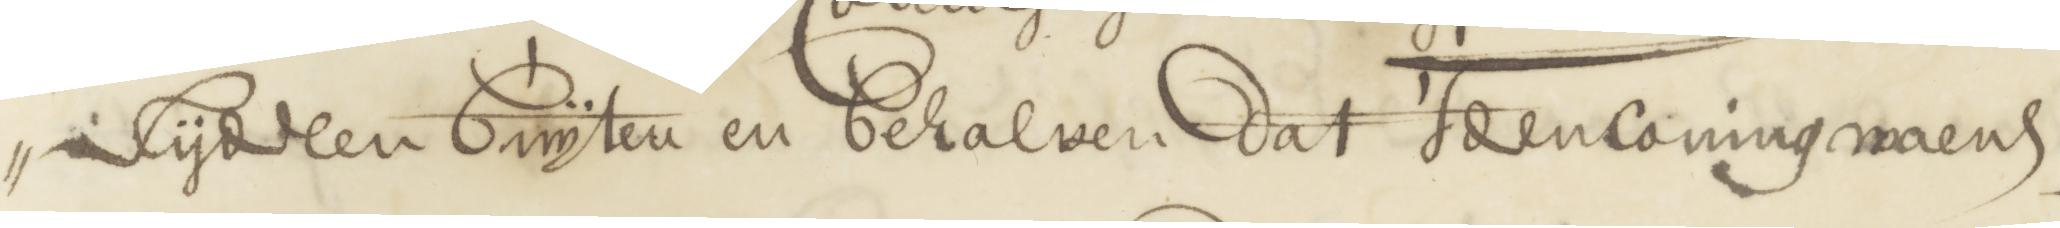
„Eijdelen buijten en behalven dat 't den Coning waeren
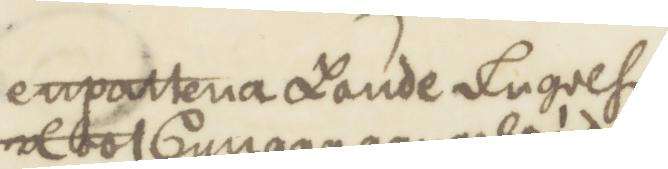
en pattena zoude Engelse
